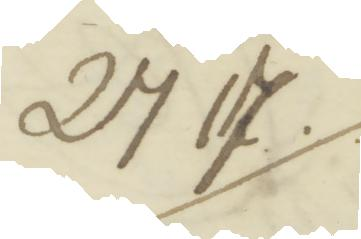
2717.
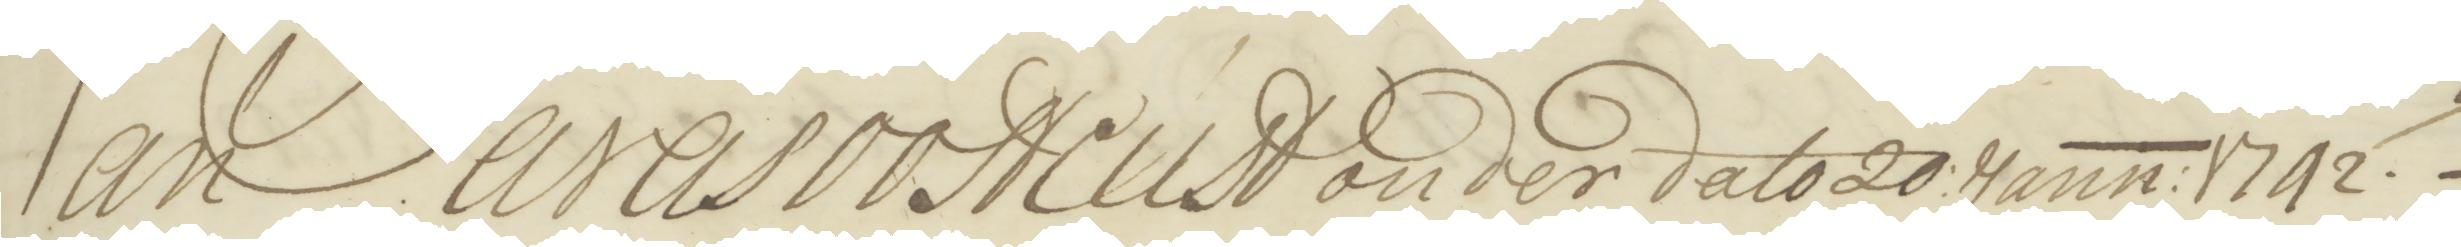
Van Javas oost cust onder dato 20: Jann: 1742.
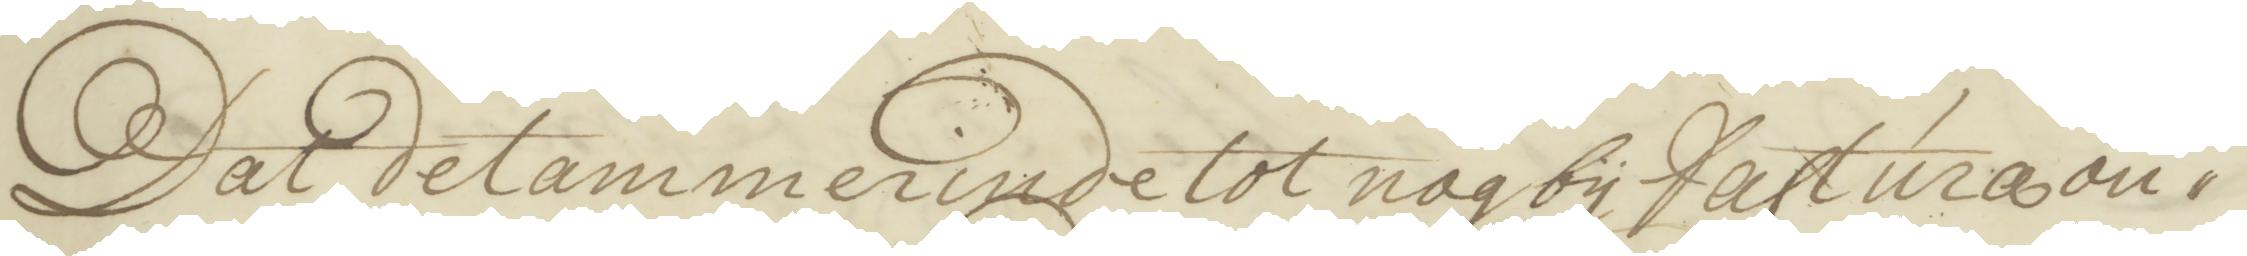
Dat de tammerinde tot nog bij factura on„
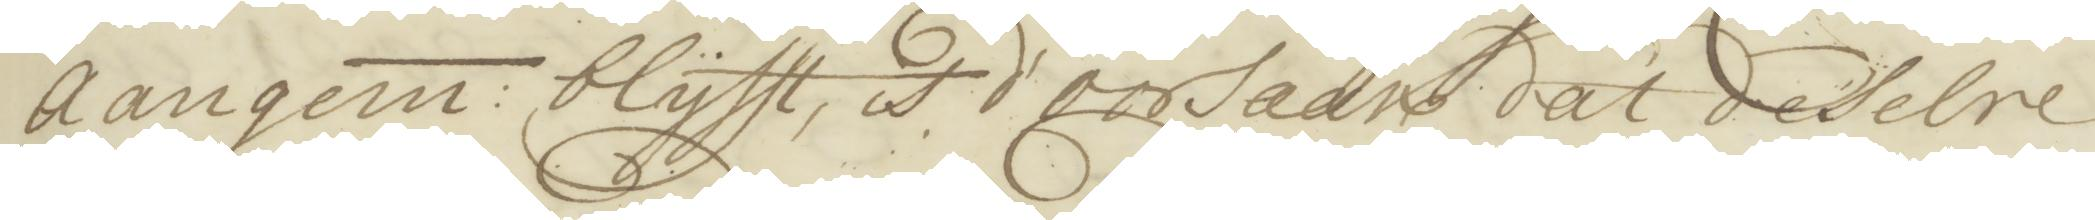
aangem: blijfft, is d’ oorsaak dat deselve
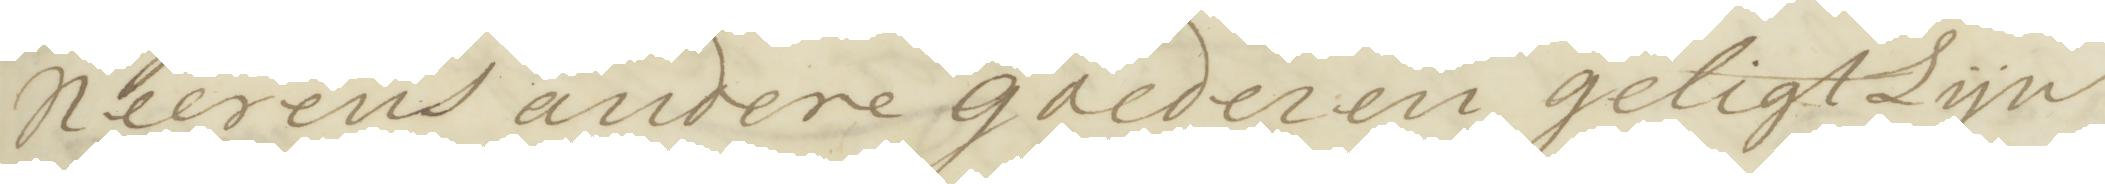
neevens andere goederen geligt zijn
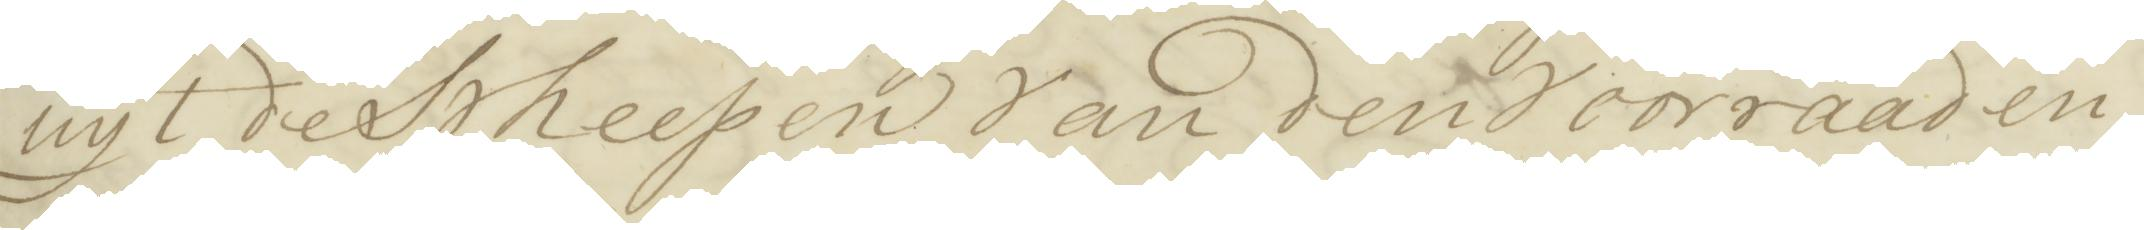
uijt de scheepen van den voorraad en
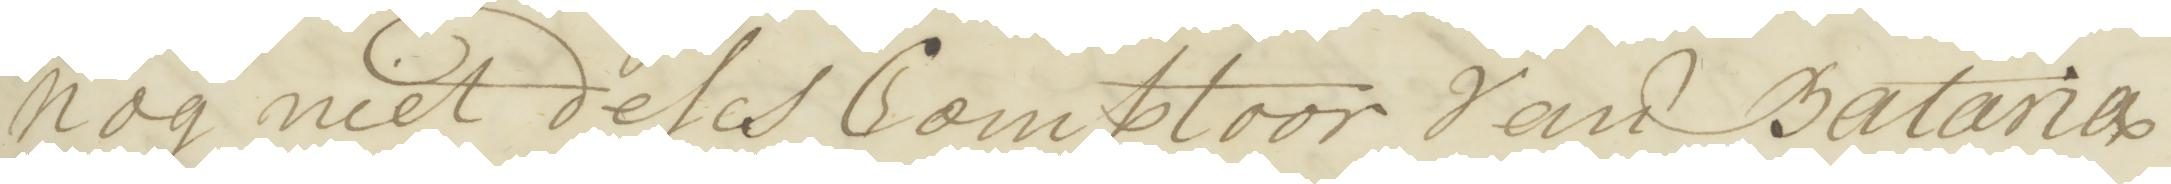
nog niet deses Comptoor van Batavia
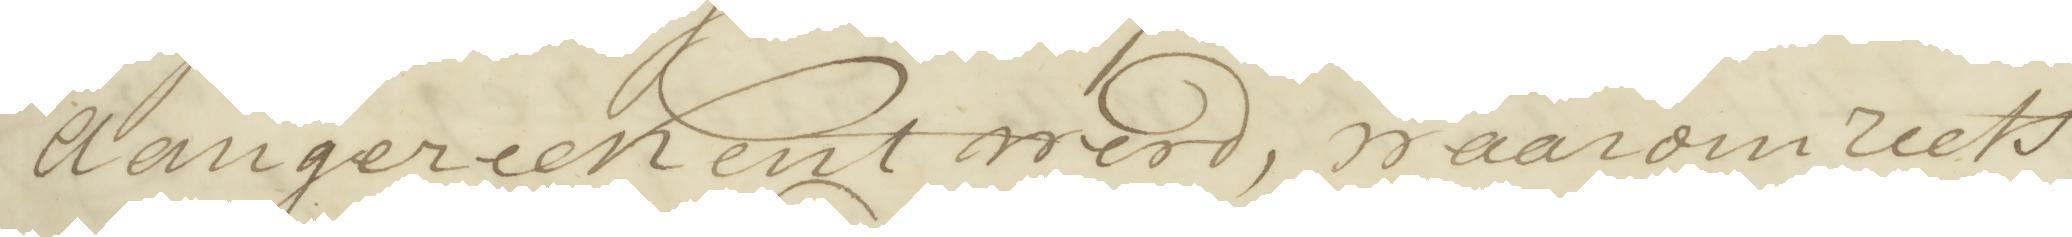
aangereekent werd, waarom reets
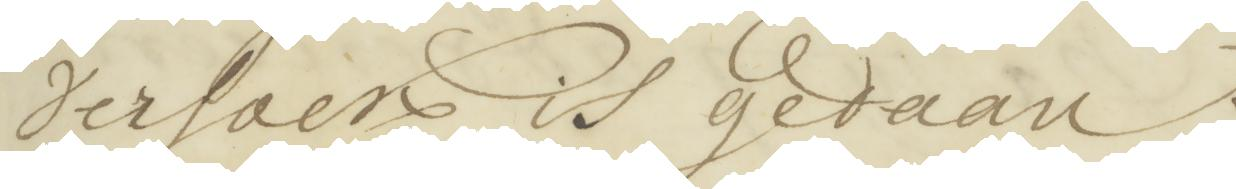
versoek is gedaan
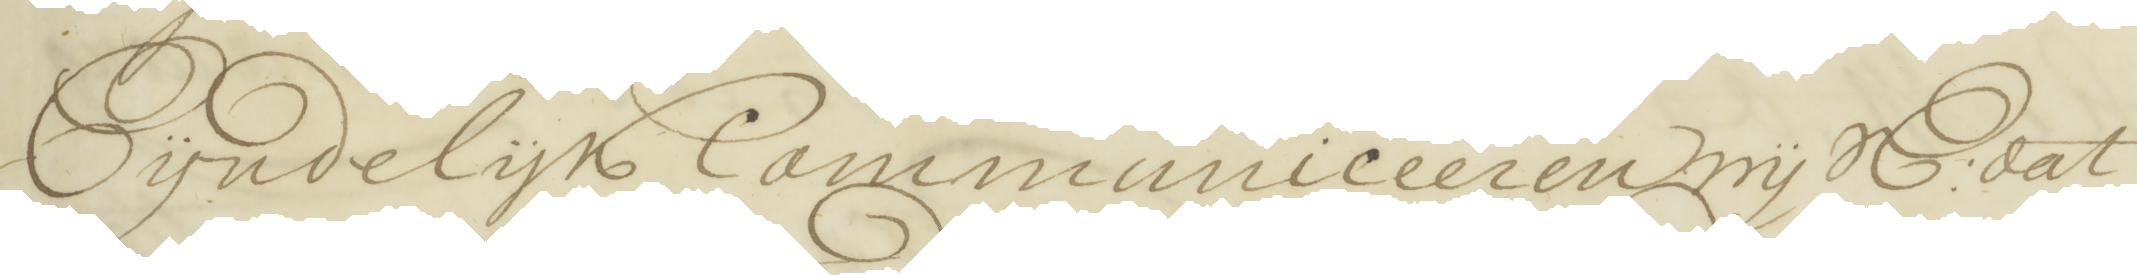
Eijndelijk communiceeren wij vE: dat
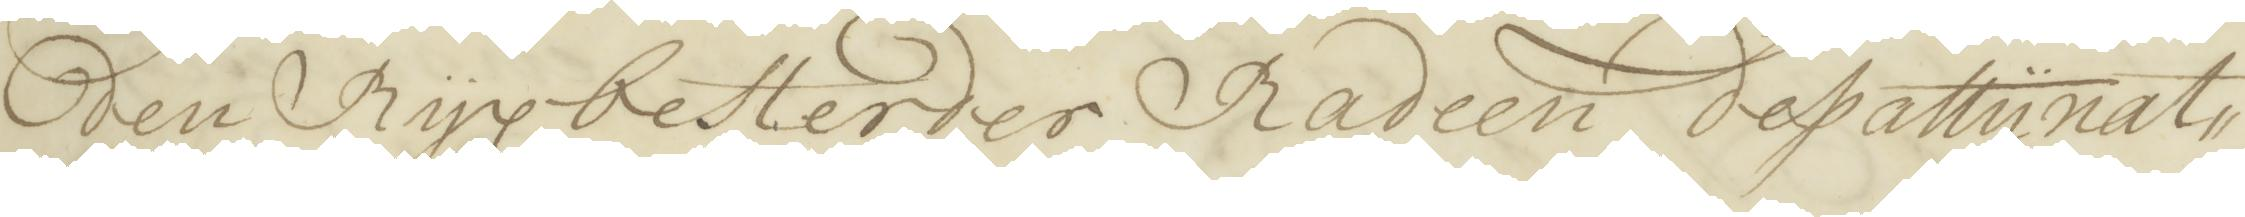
den Rijx besterder Radeen depattij nat„
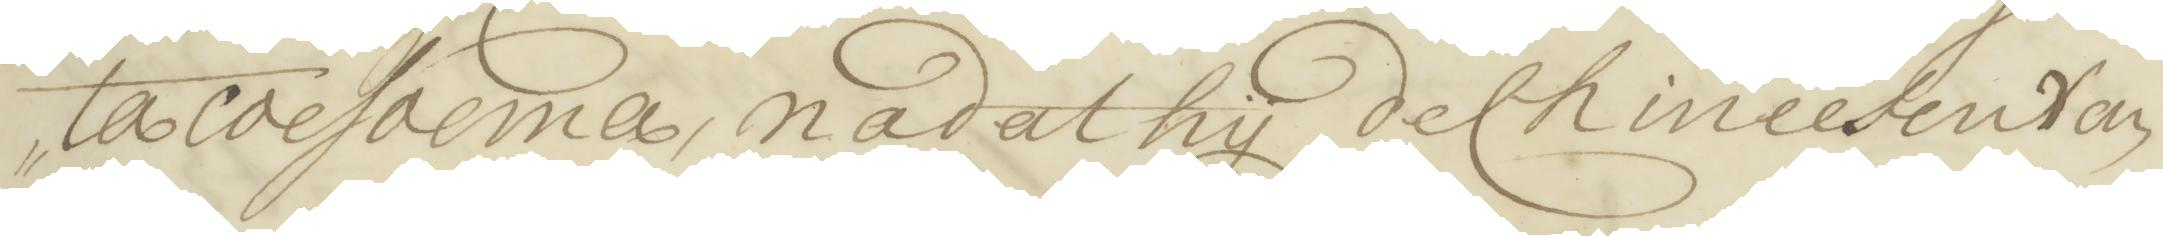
„ta coesoema, nadat hij de Chineesen van
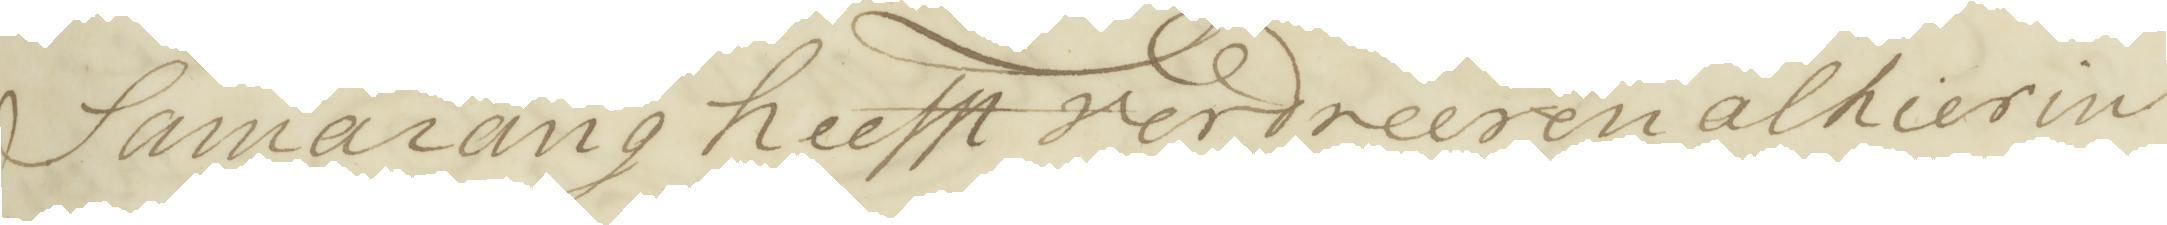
Samarang heefft verdreeven alhier in
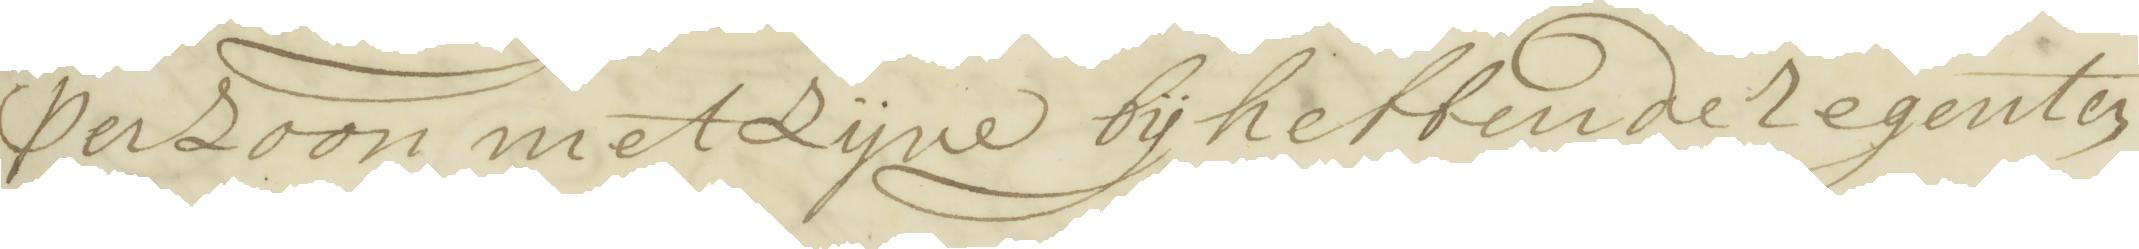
perzoon met zijne bij hebbende regenten
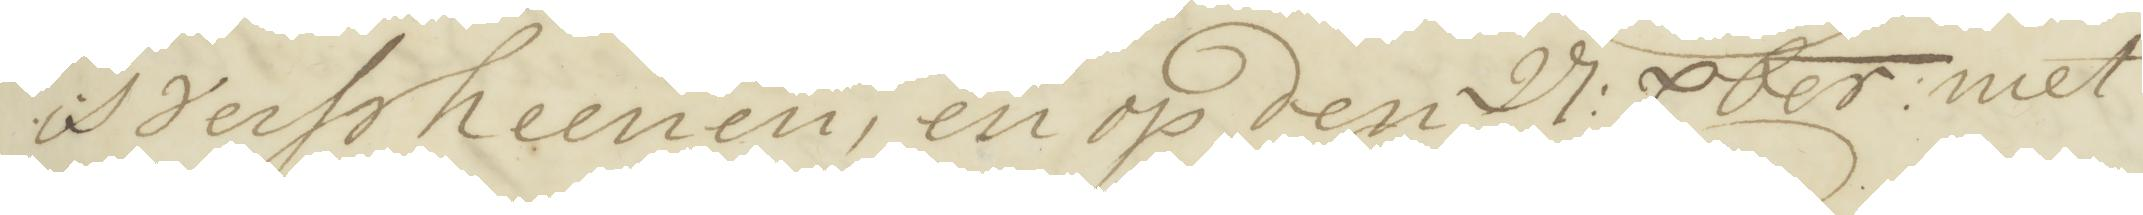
is verscheenen, en op den 27: xber: met
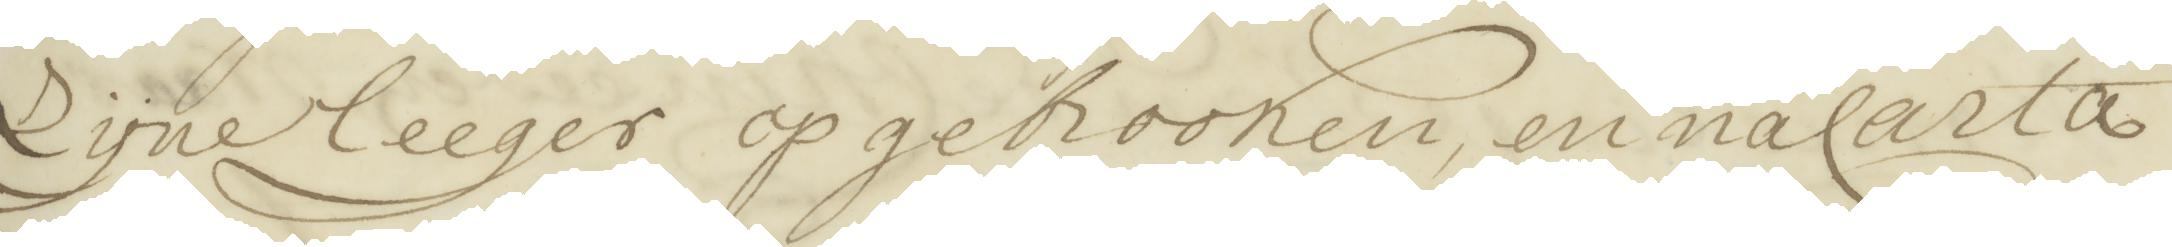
zijne leeger op gebrooken, en na Carta
